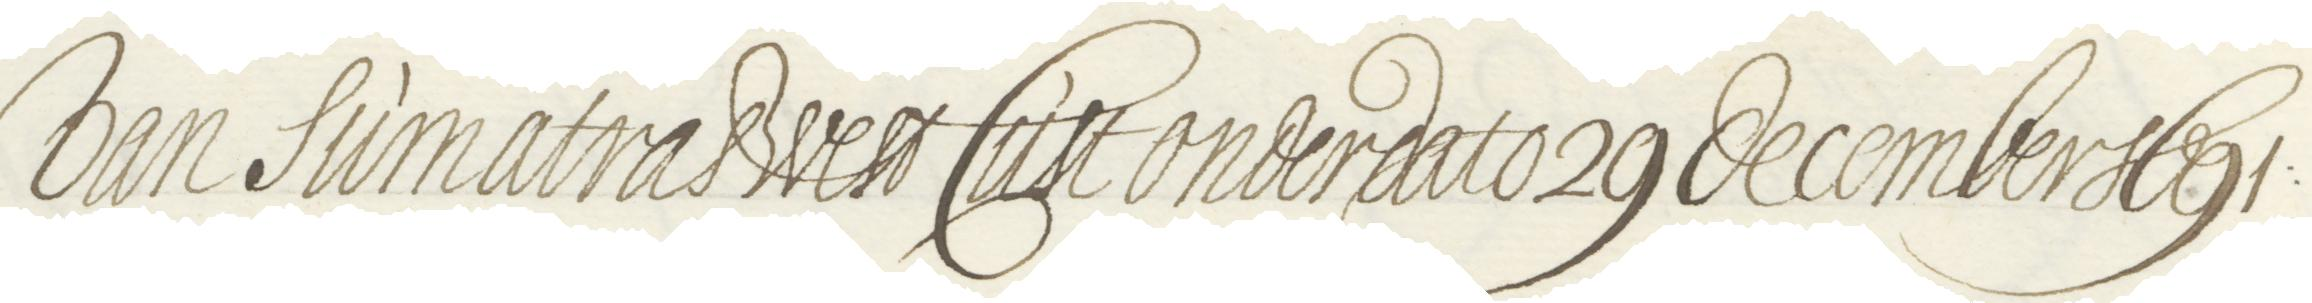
Van Sumatras west Cust onderdato 29 December 1691:
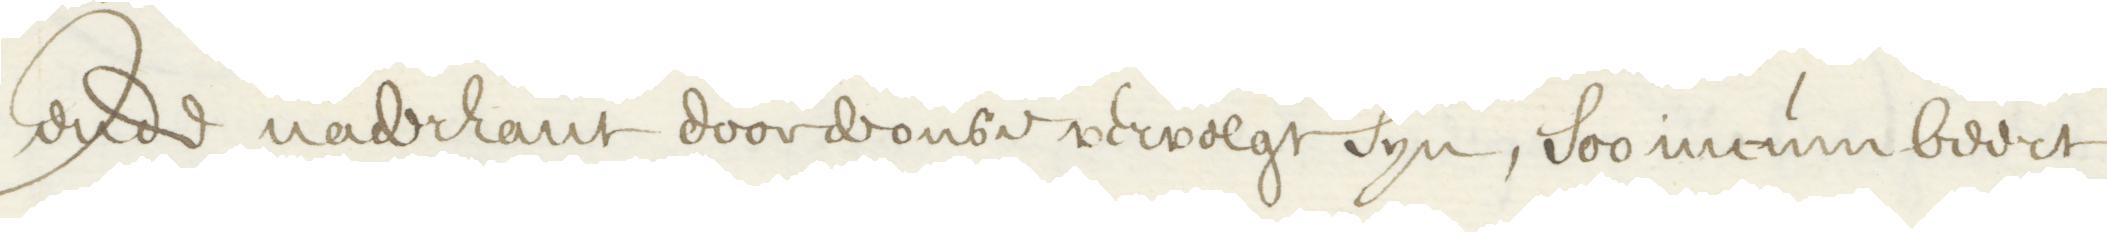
ende naderhant doorde onse vervolgt Syn, Soo incumbeert
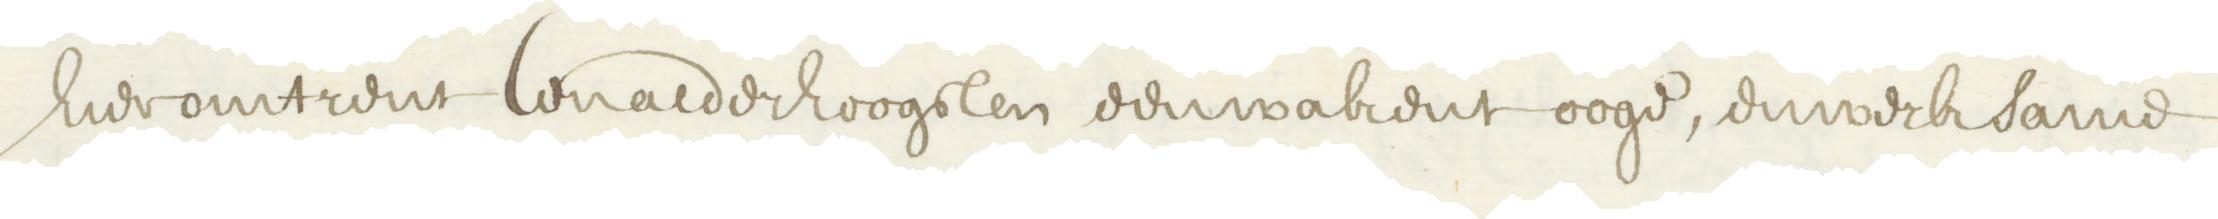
hier omtrent ten alderhoogsten een wakent ooge, en werksame
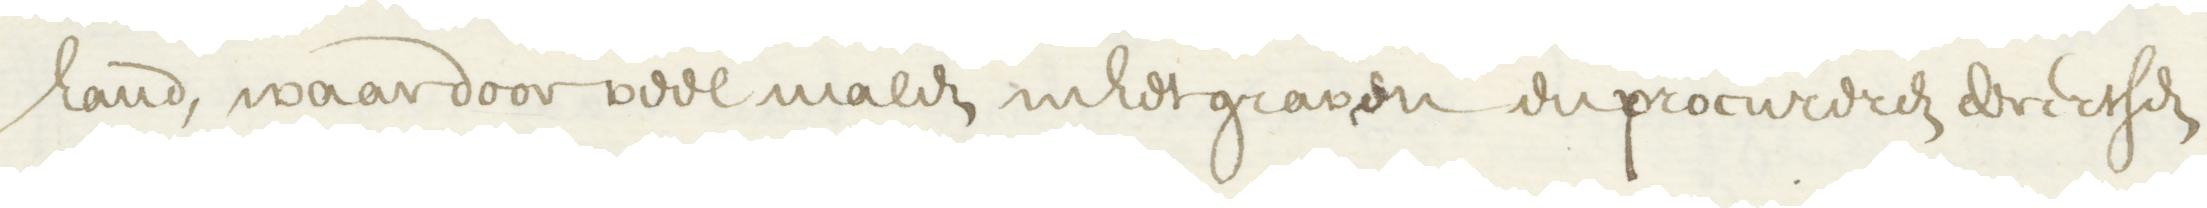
hand, waar door veel malen in het graven en procureren der ertsen
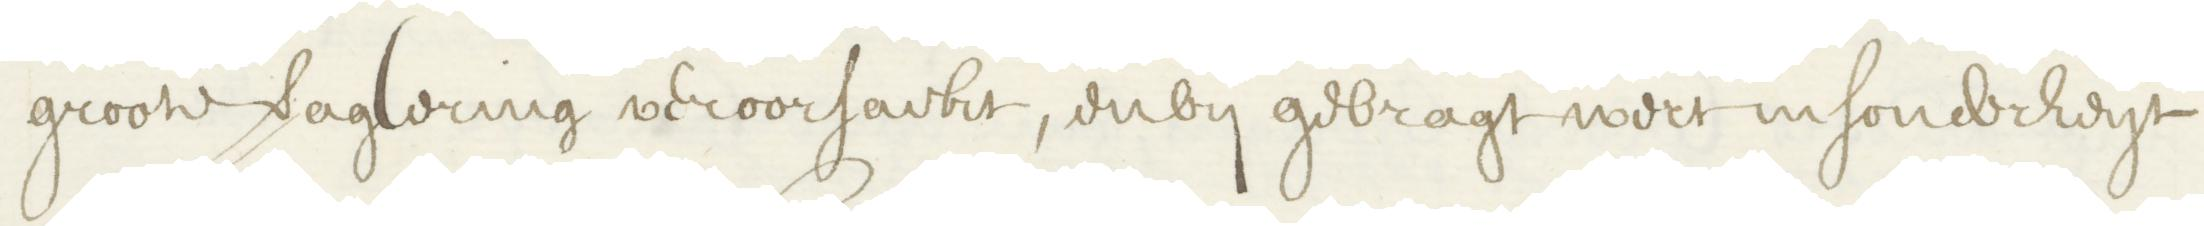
groote veragtering veroorsaekt, en bij gebragt wert insonderheijt
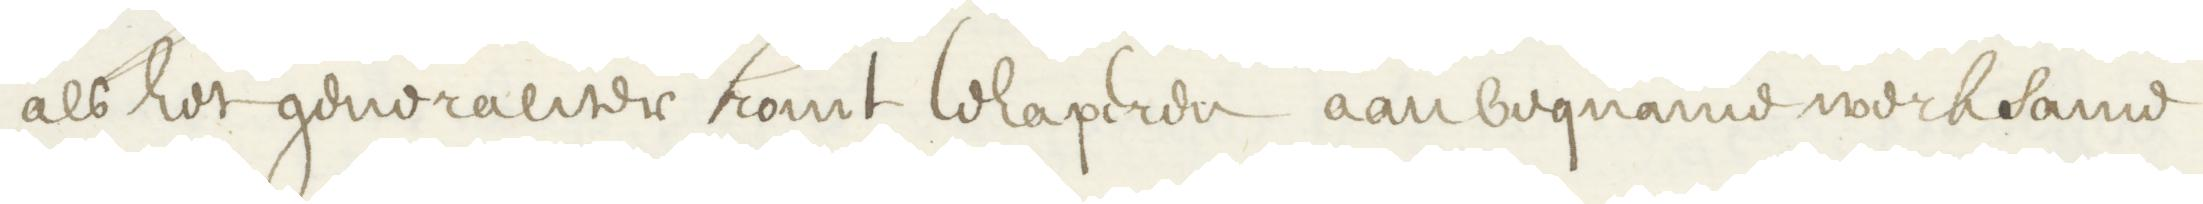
als het generaliter komt tehaperen aan bequame werksame
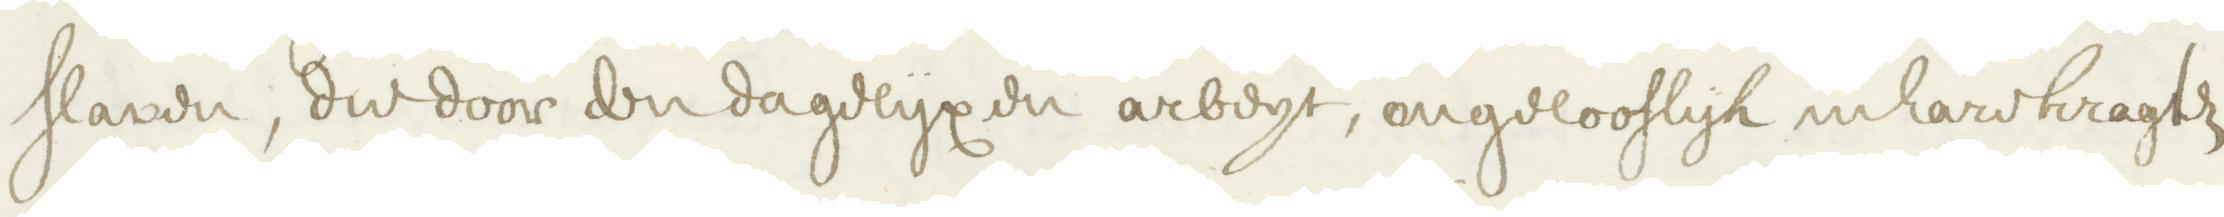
slaven, die door den dagelijxen arbeyt, ongelooflijk in hare kragten
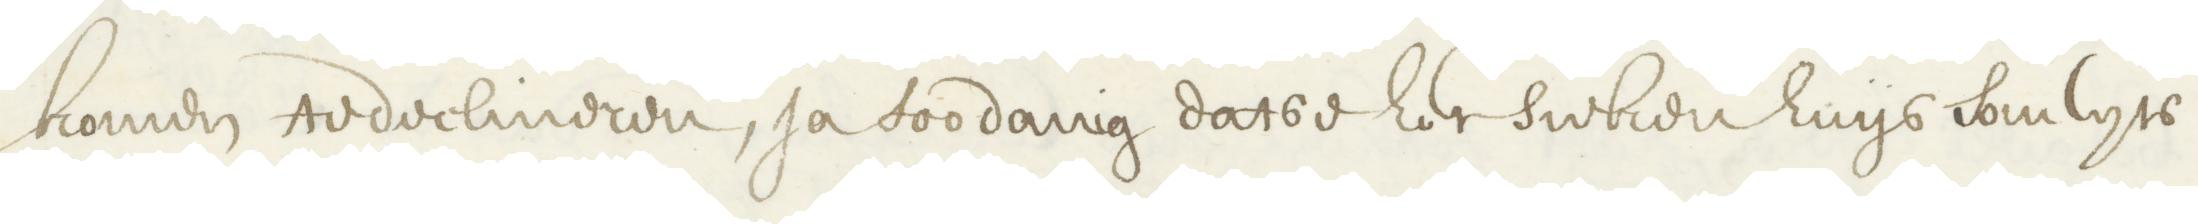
komen te declineren, ja soodanig datse het sieken huijs som tyts
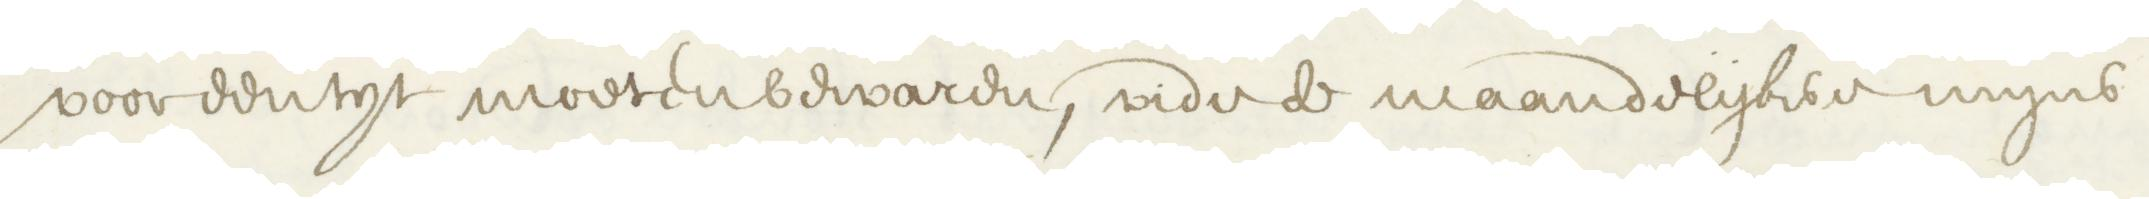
voor een tyt moeten bewaren, vide de maandelijkse mijns
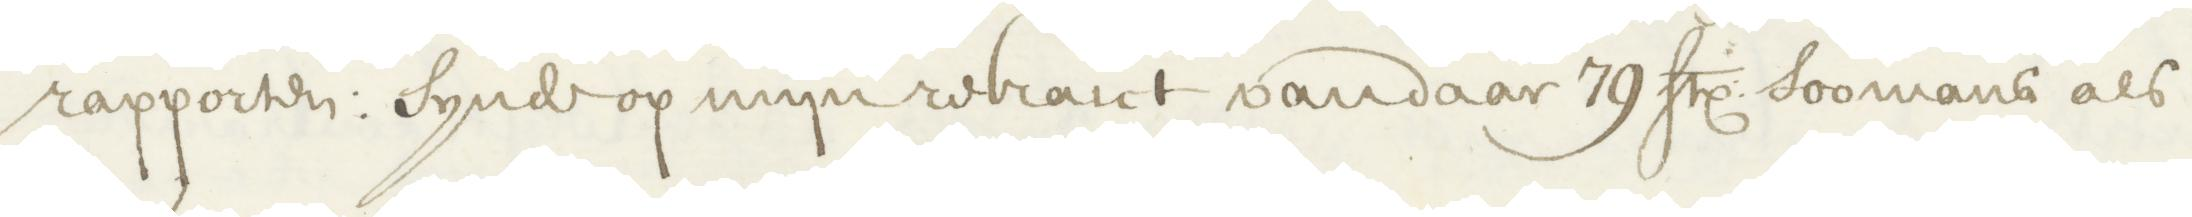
rapporten: Synde op mijn retraict vandaar 79 stx: soo mans als
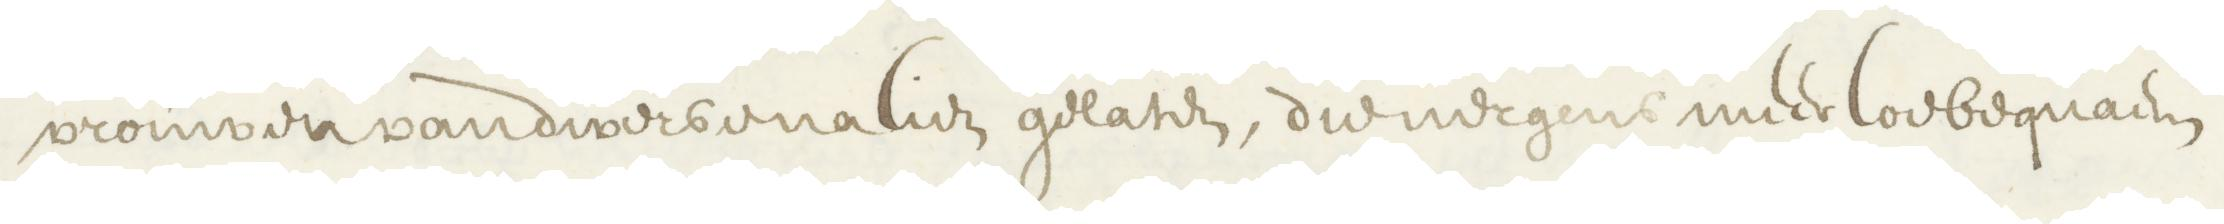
vrouwen van diverse natien gelaten, die nergens meer toebequaem
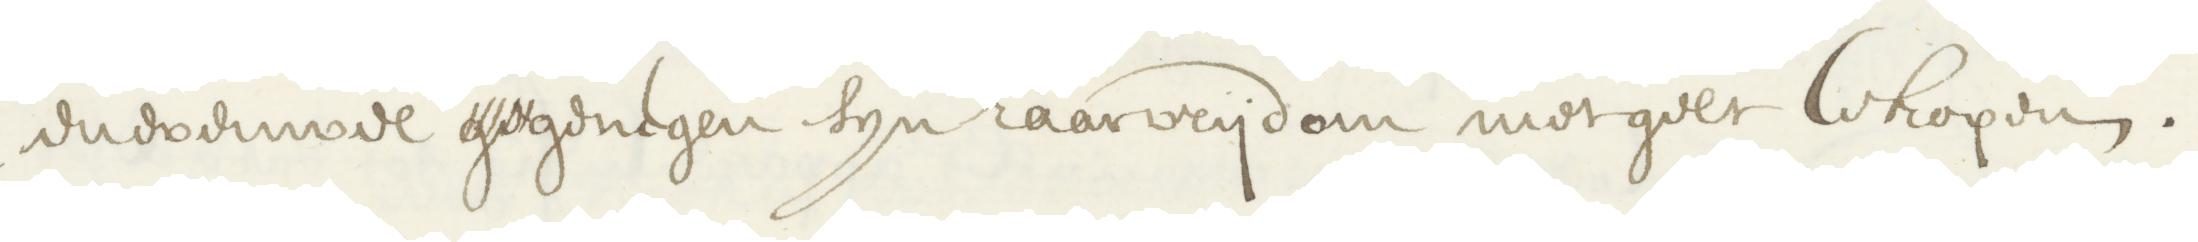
en evenwel gegenegen syn haar vrijdom met gelt tekopen.
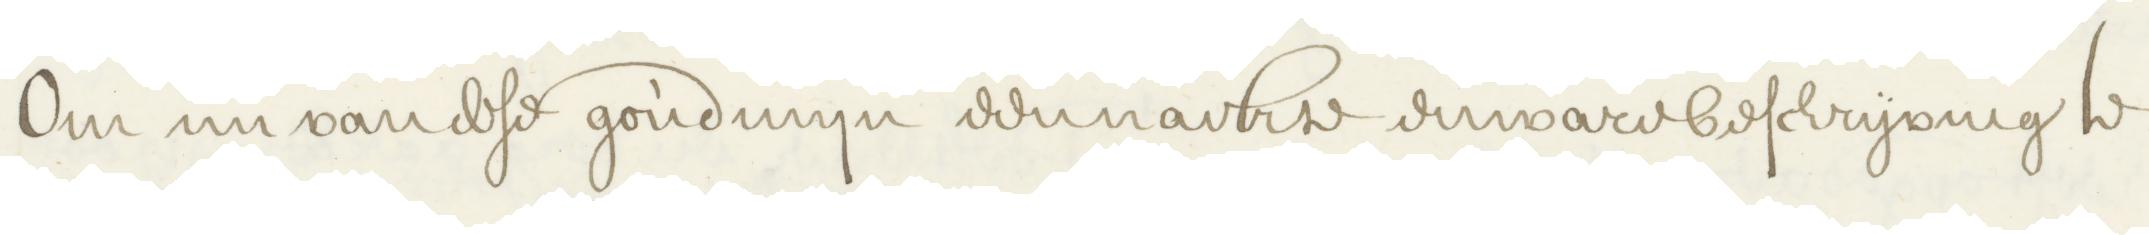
Om nu van dese goudmijn een naekte en ware beschrijving te
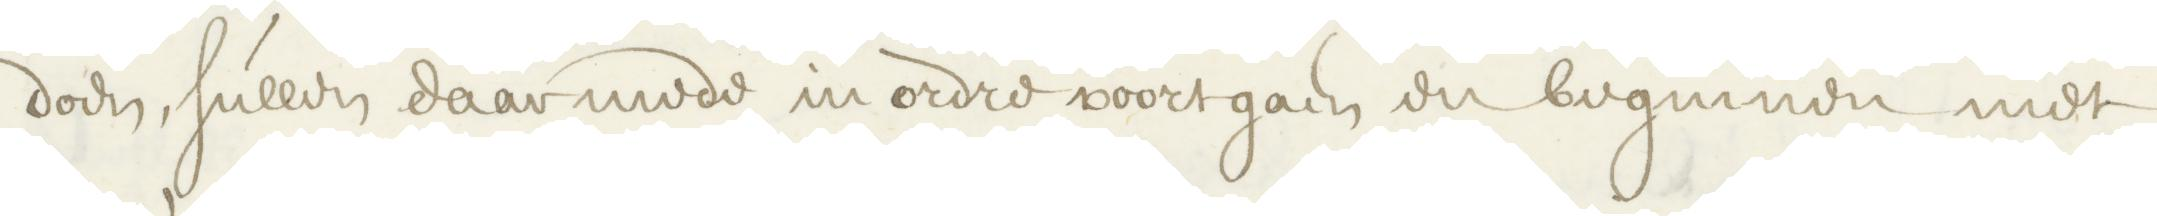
doen, sullen daar mede in ordre voortgaen en beginnen met
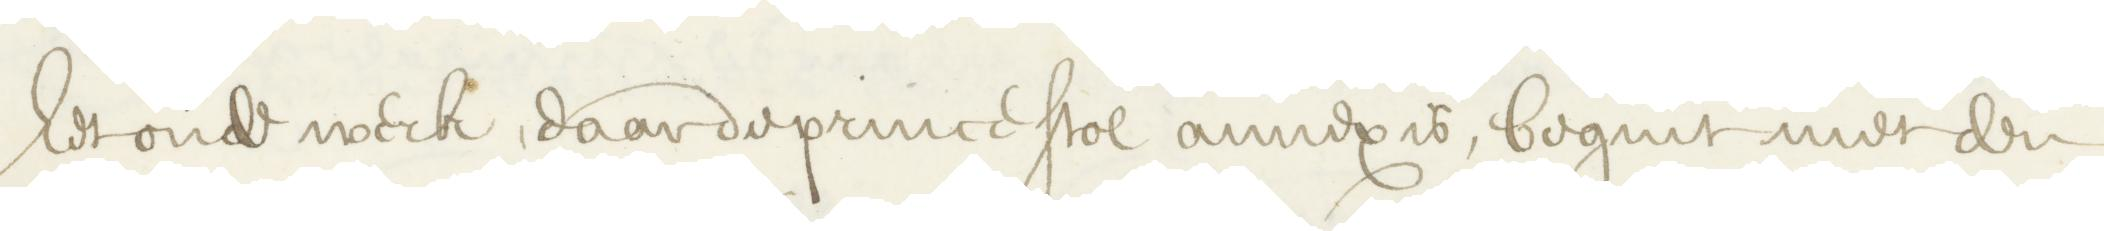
het oude werk, daar deprince stol annex is, begint met den
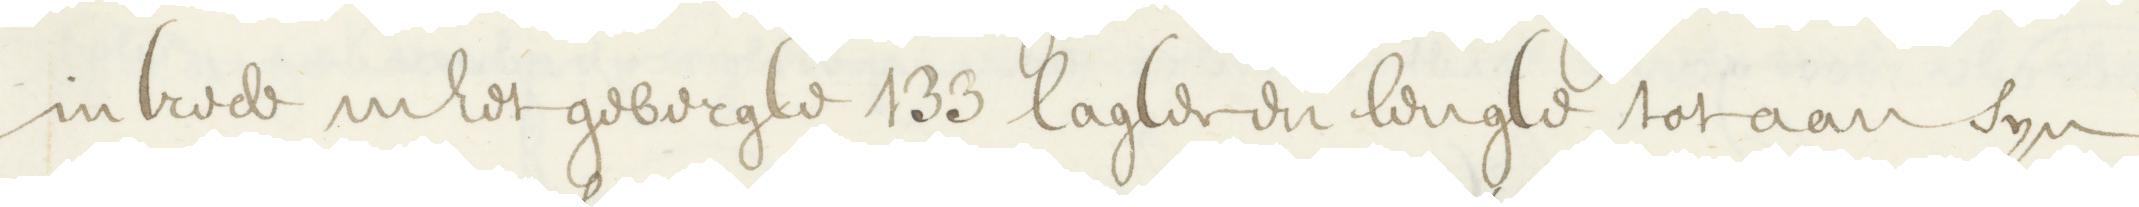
in trede in het gebergte 133 lagter en lengte tot aan syn
